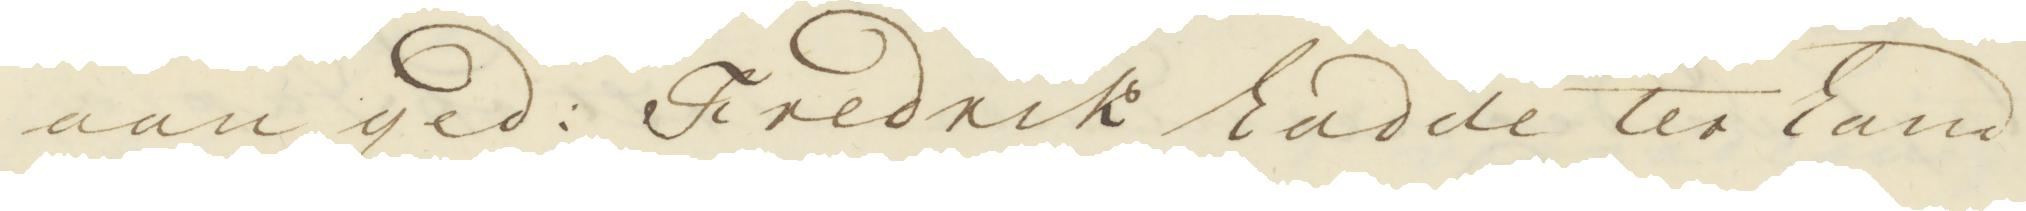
aan ged: Fredrik hadde ter hand
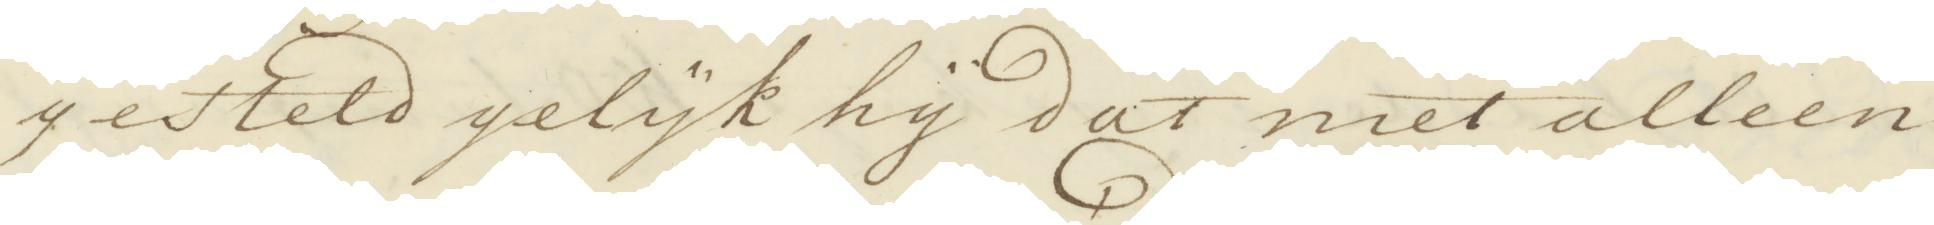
gesteld gelijk hij dat niet alleen
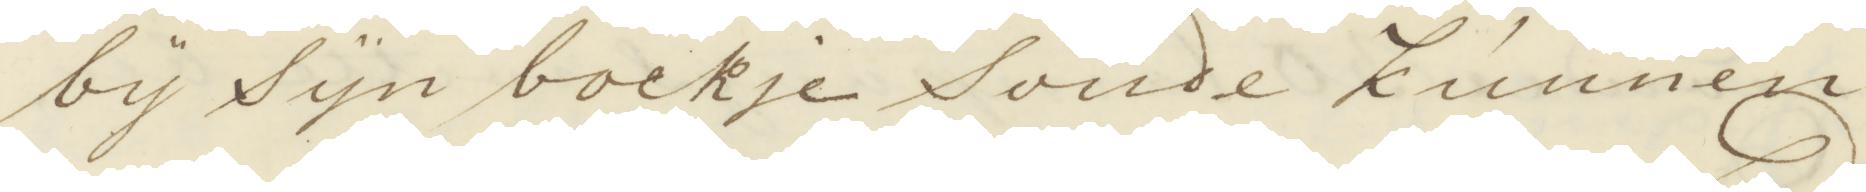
bij sijn boekje soude kunnen
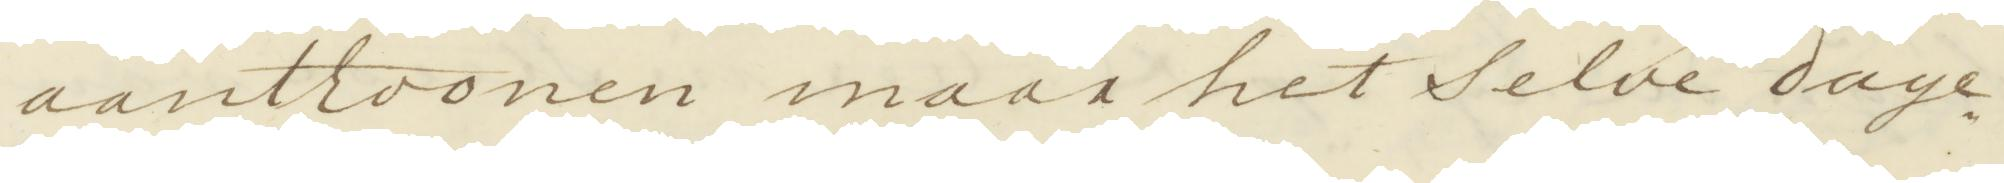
aanthoonen maar het selve dage„
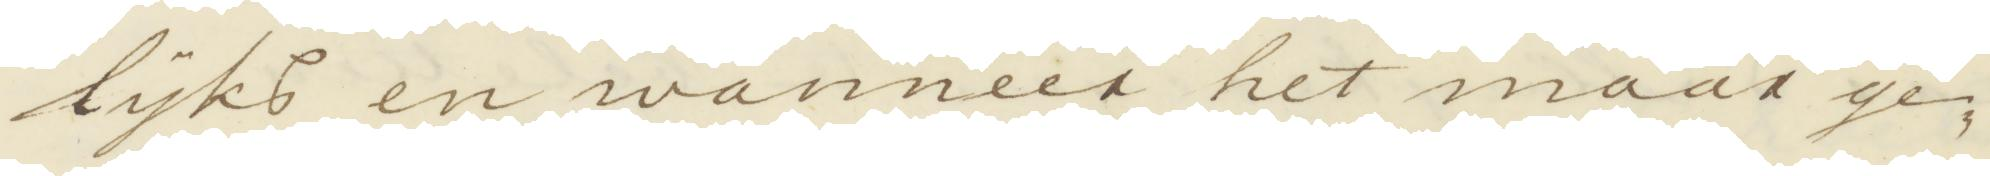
lijks en wanneer het maar ge„
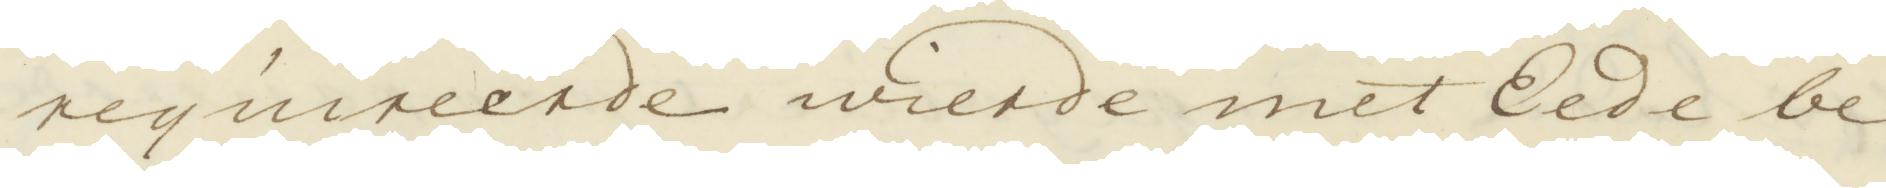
requireerde wierde met Eede be
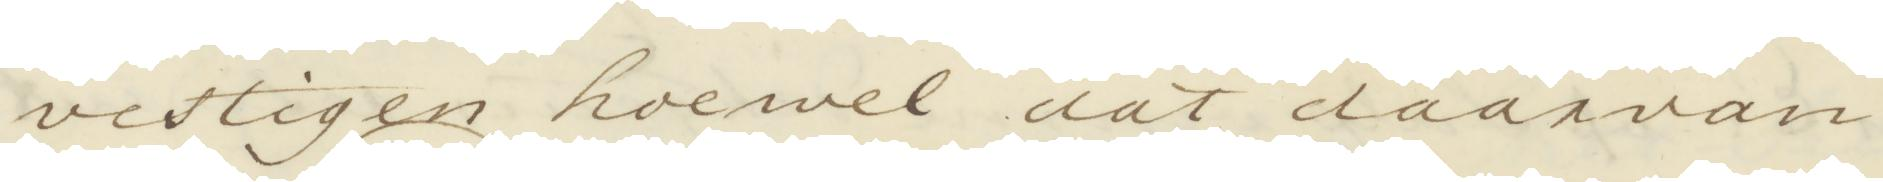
vestigen hoewel dat daarvan
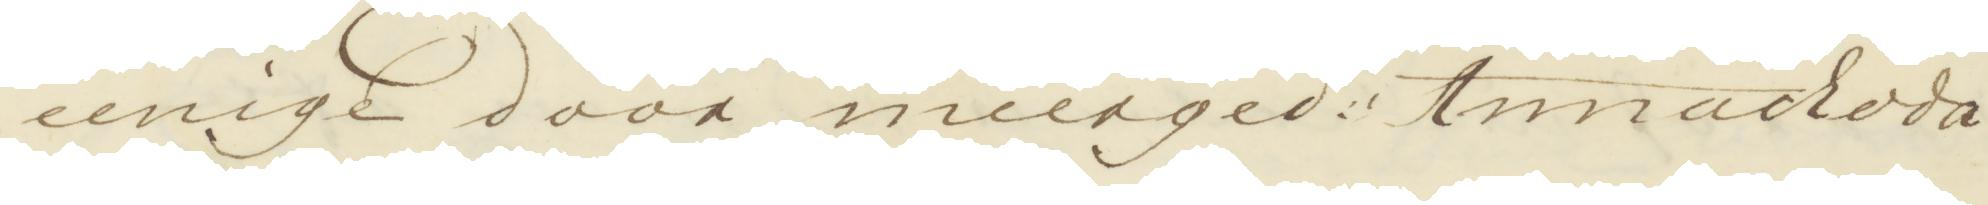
eenige door meerged: Annachoda
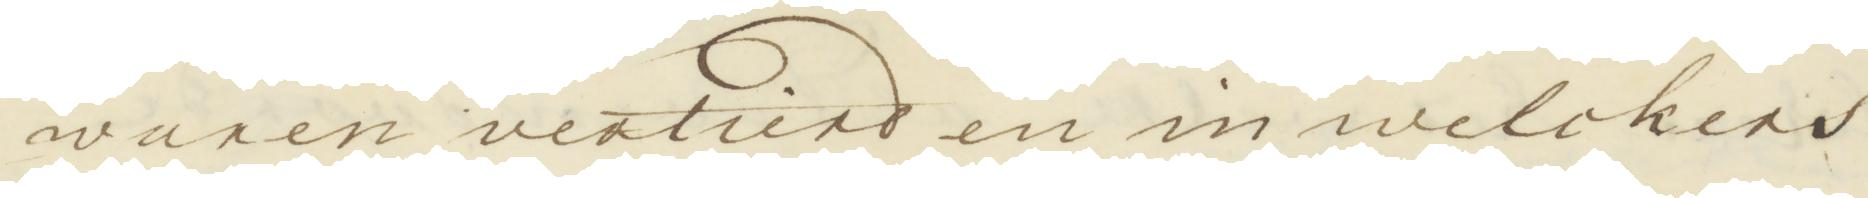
waren vertierd en in welckers
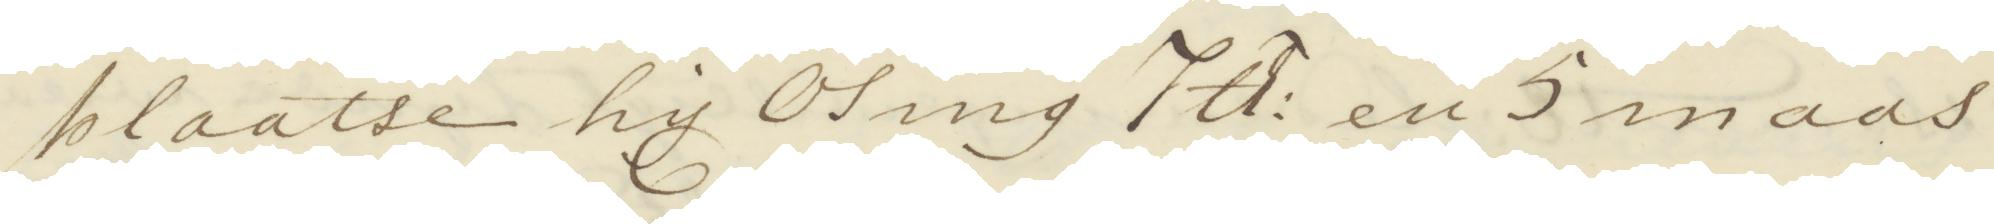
plaatse hij Osing 7 th: en 5 maas
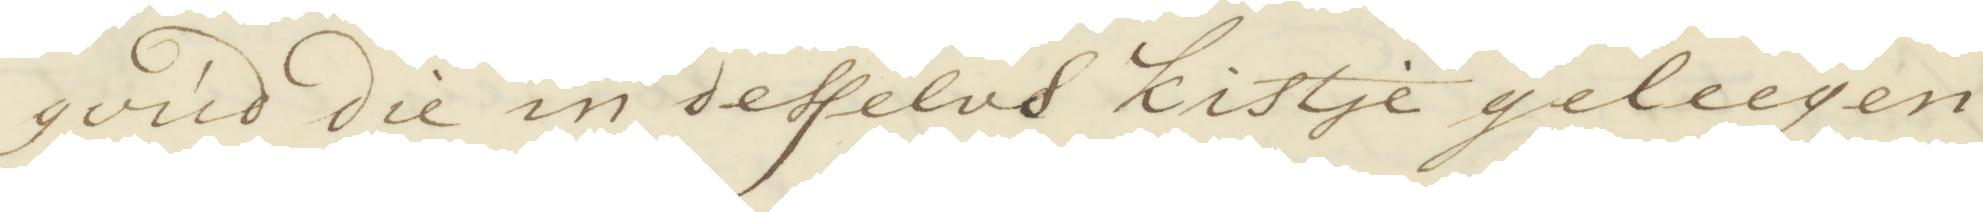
goud die in desselvs kistje geleegen
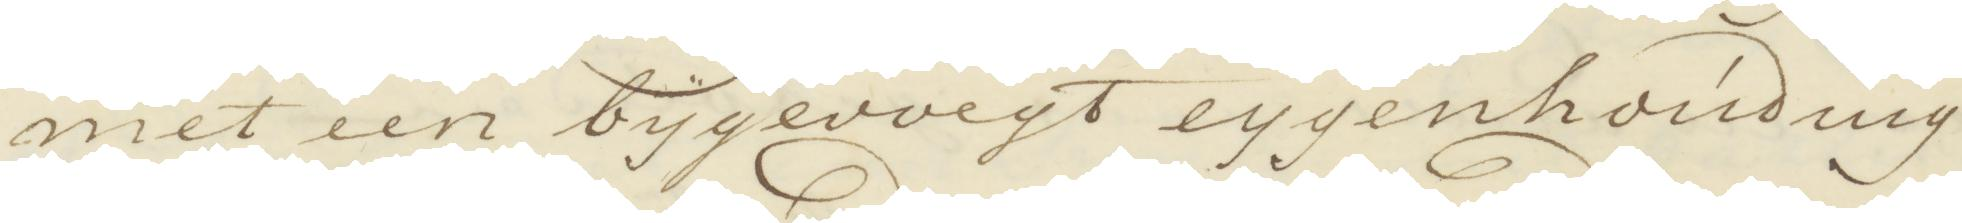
met een bijgevoegt eijgenhouding
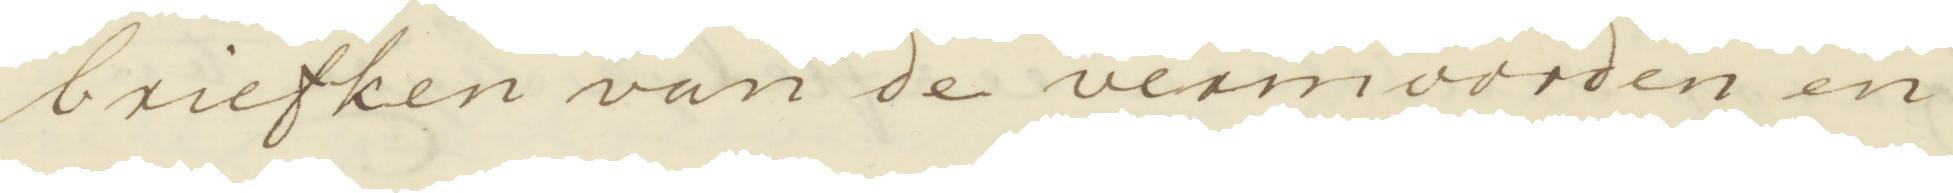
briefken van de vermoorden en
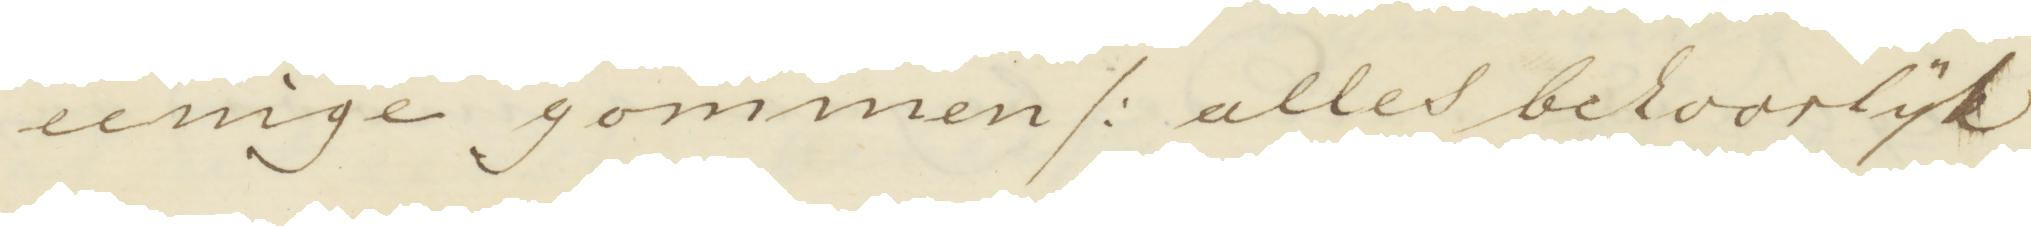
eenige gommen /: alles behoorlijk
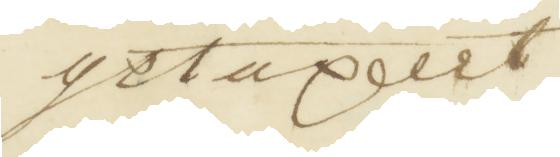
getaxeert
